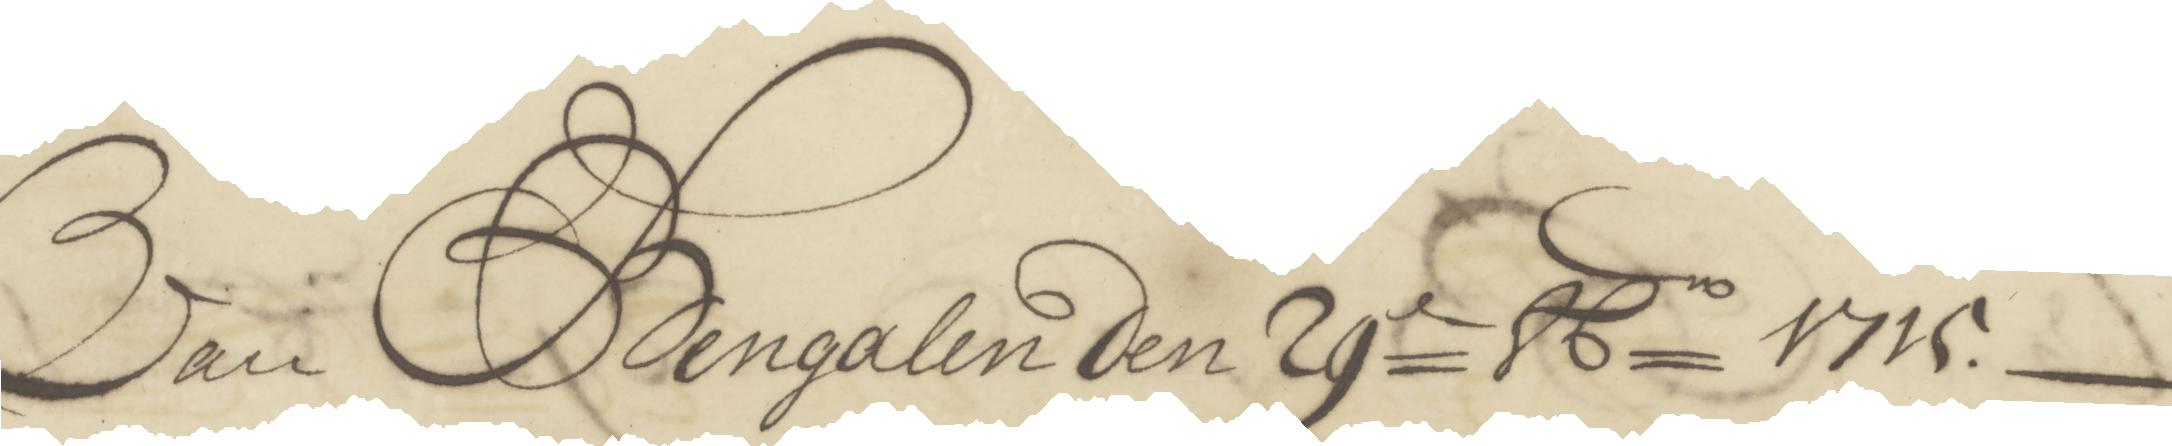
Van Bengalen den 29=e 8b=r 1715. —
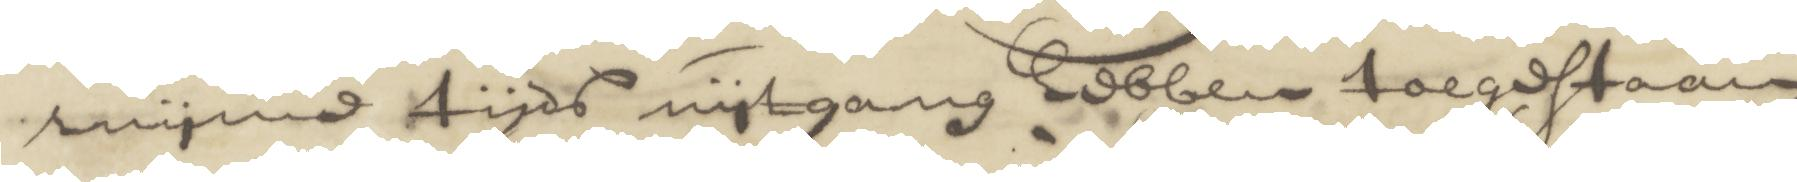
ruijme tijds uijtgang hebben toegestaan
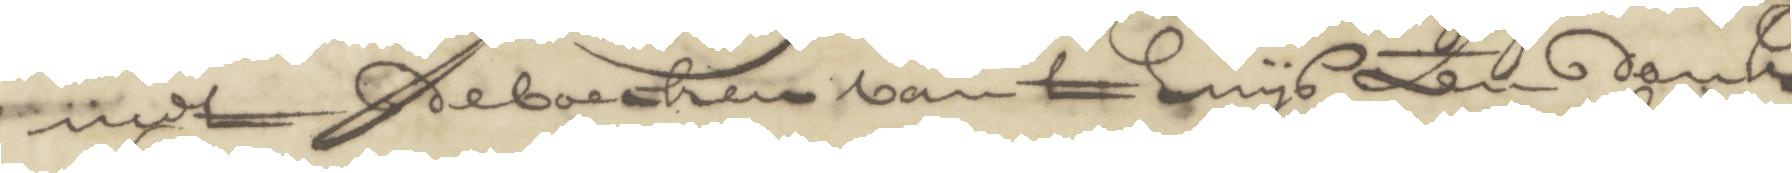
met deboecken van 't huijs ten dank
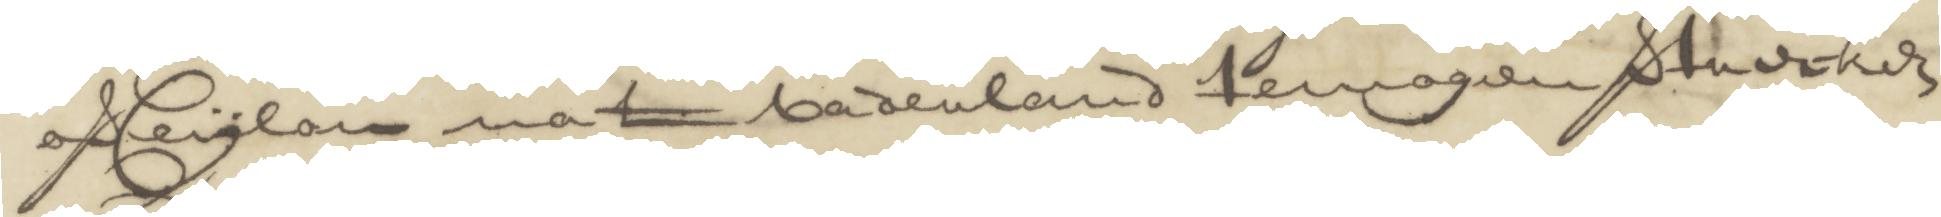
over Ceijlon na ’t vaderland temogen vertrecken
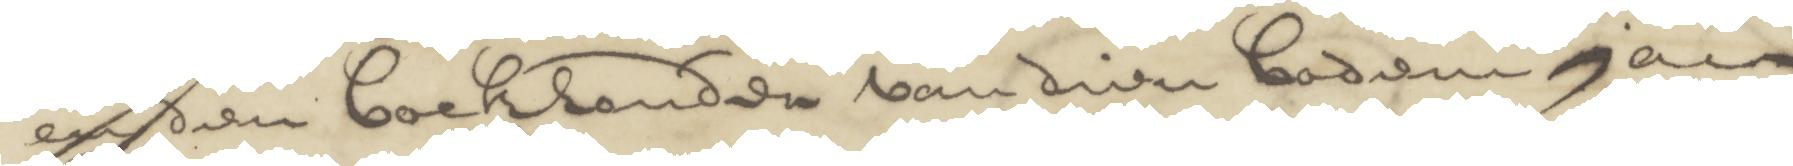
en den boekhouder van dien bodem Jan
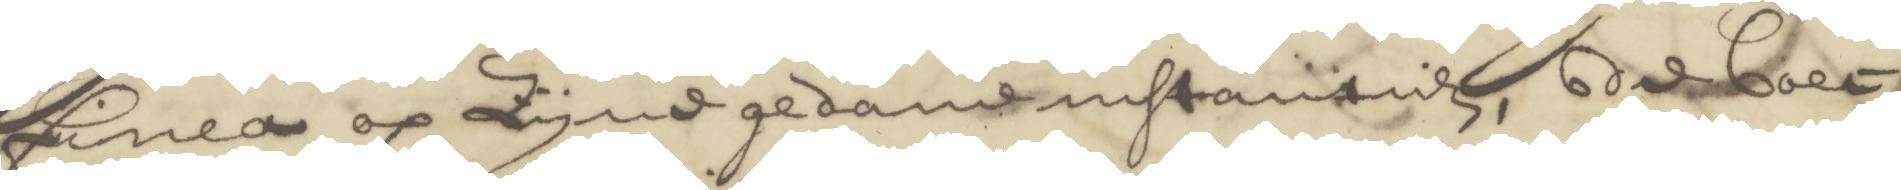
Finea op zijne gedane instantien, de boec
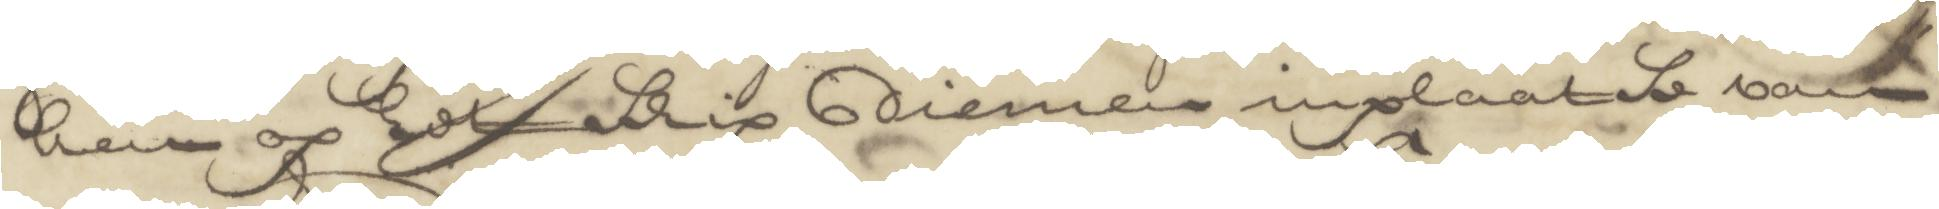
ken op het schip diemen inplaatse van
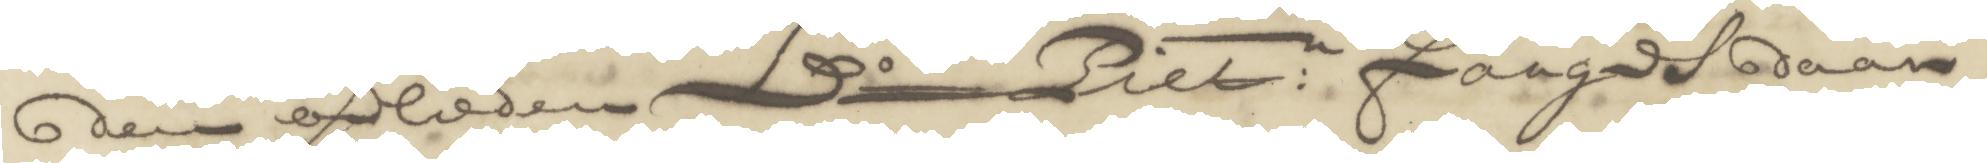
den overleden d=o Piet:r Farges daar
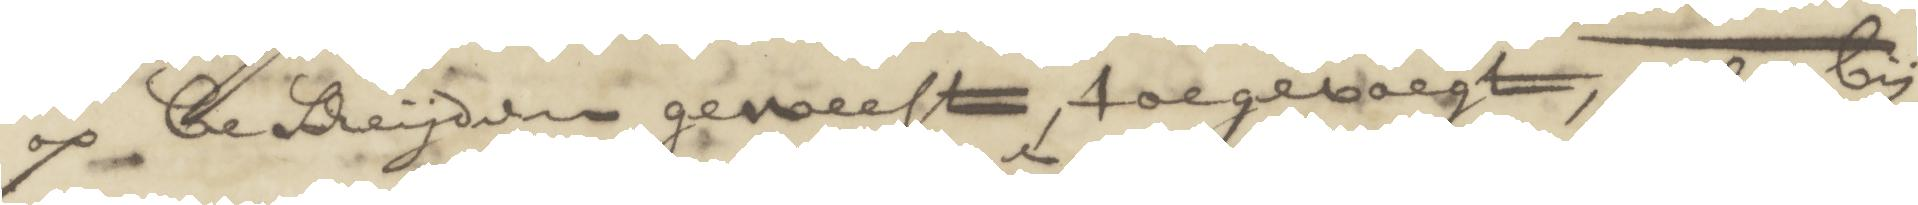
op bescheijden geweest, toegevoegt, gelijk bij
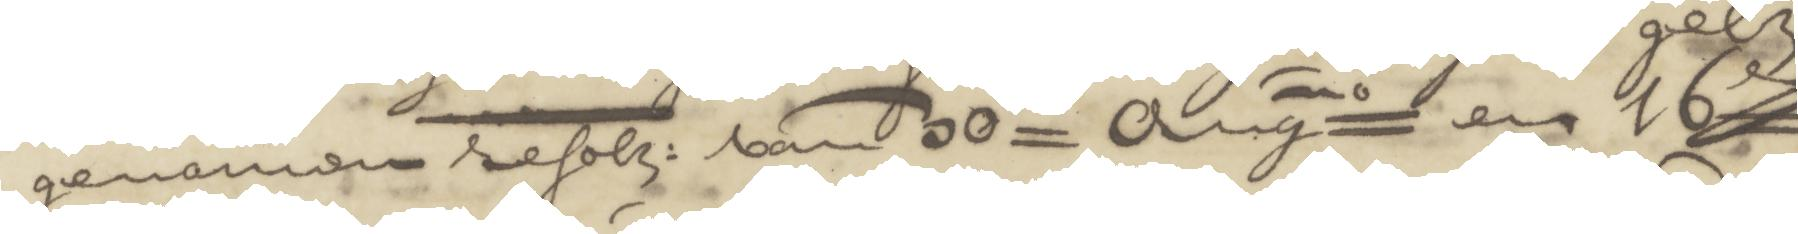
genomen resol: van 30=e Aug=o en 16=e
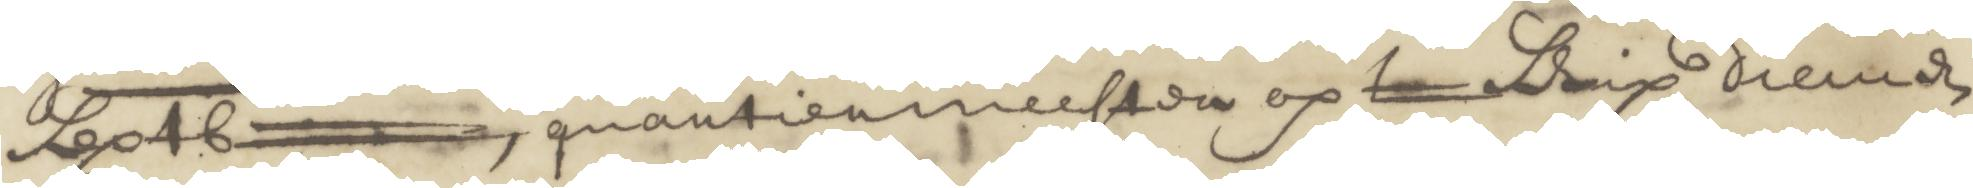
Septb=r, quantiermeester op 't schip diemen
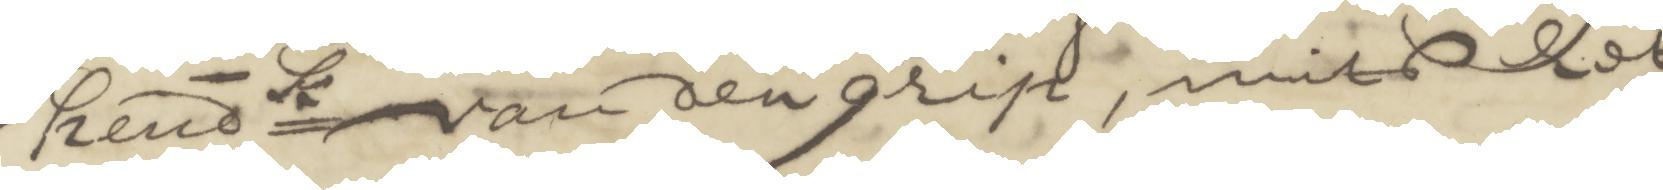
hend=k van den grip, mits het
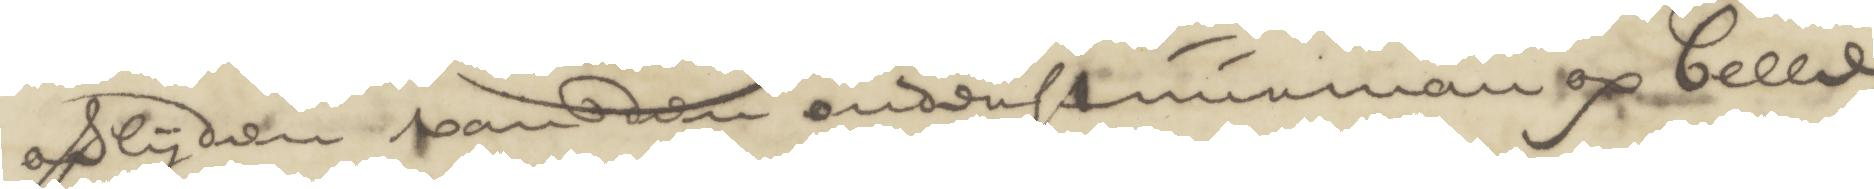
overlijden van den onderstuurman op belle
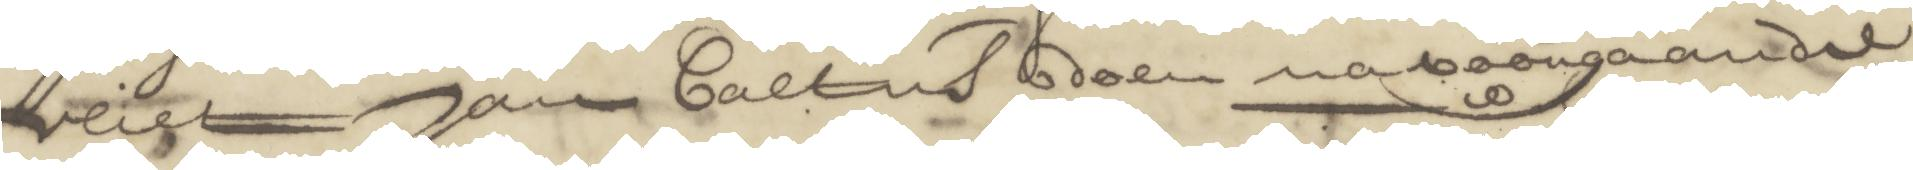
Vliet Jan Baltus doen na voorgaande
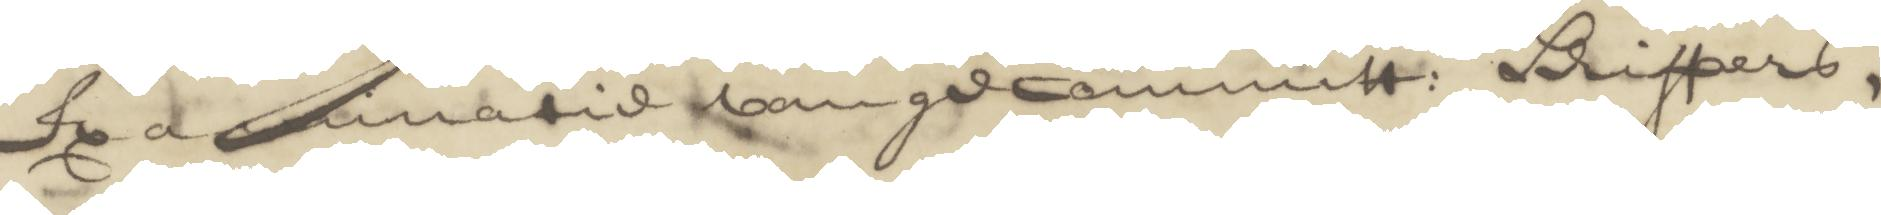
Examinatie van gecommitt:e schippers
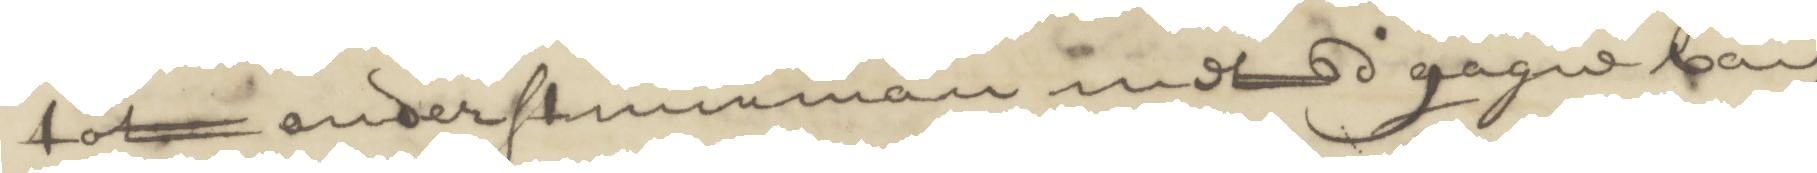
tot onderstuurman met d’ gagie van
